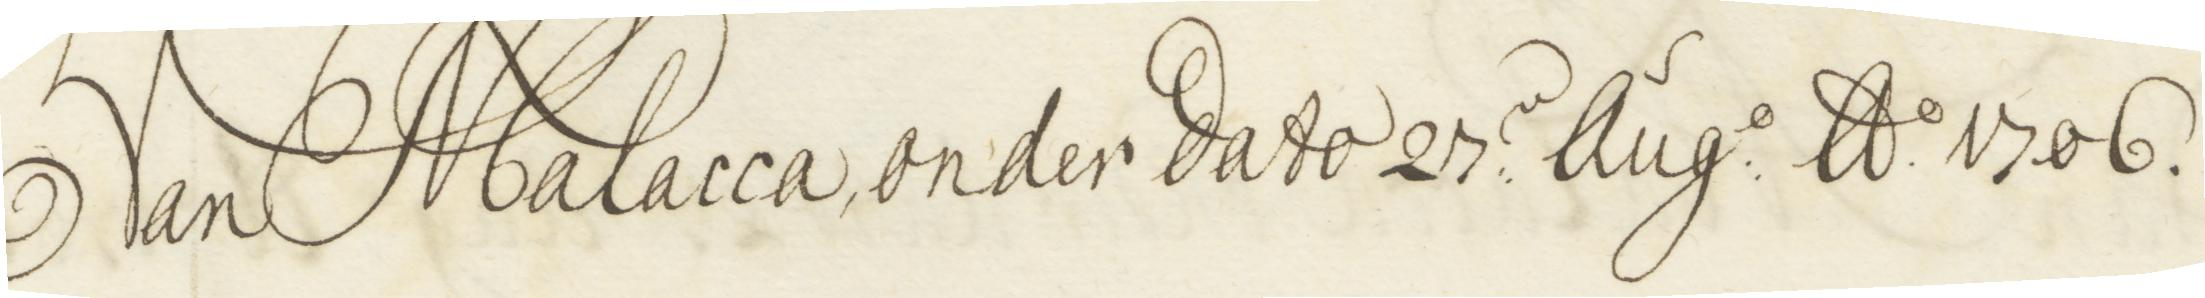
Van Malacca, onder dato 27:n Aug:o A.o 1706.
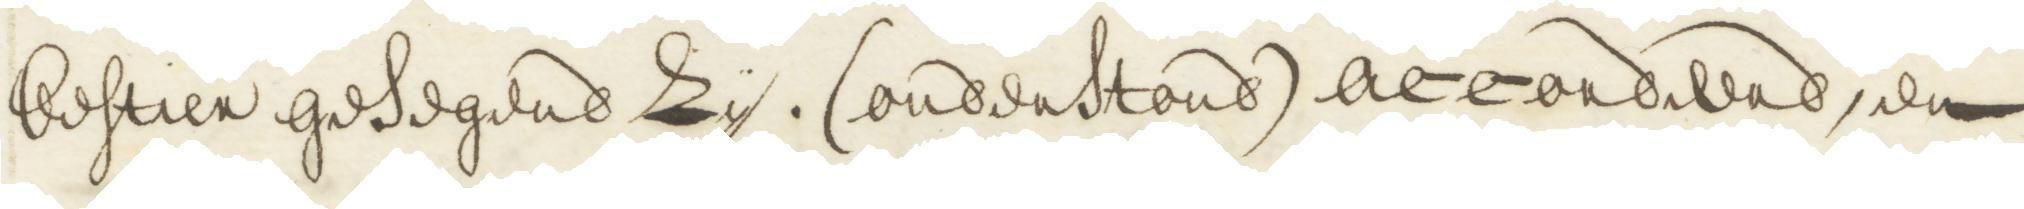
bestier gesegend zij. (onderstond) accordeerd, en
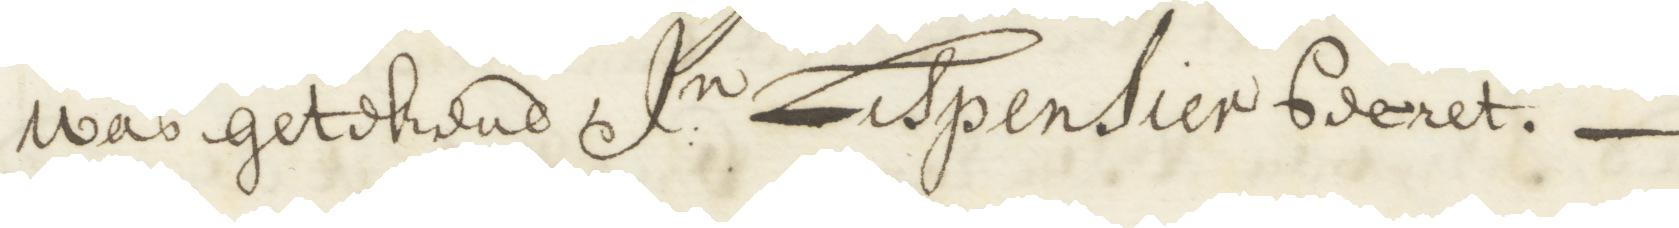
was getekend I:n Lispensier secret.s _
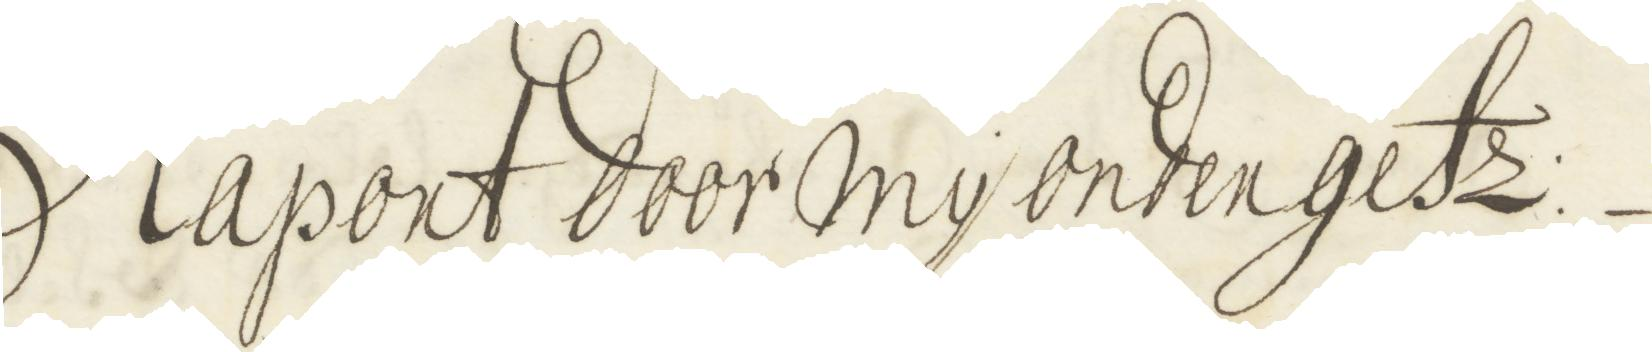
Raport door mij onder gesz: _
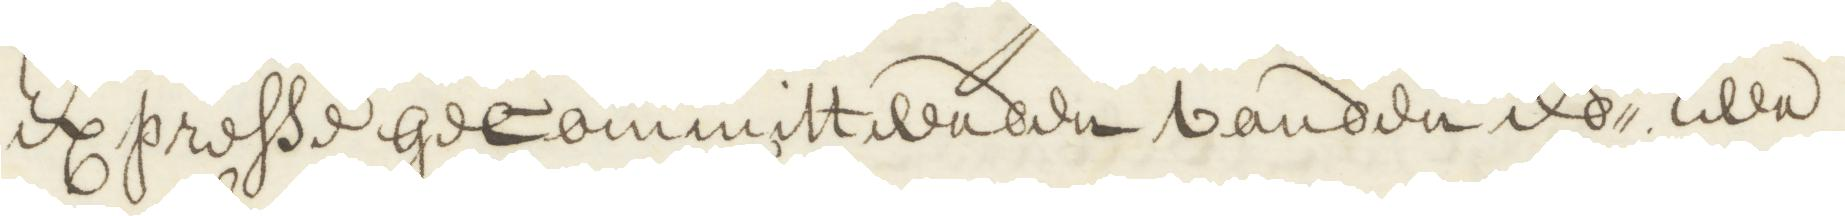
Expresse gecommitteerden van den Ed„le heer
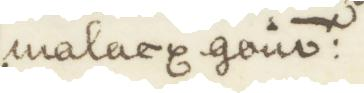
molocx gouv:r
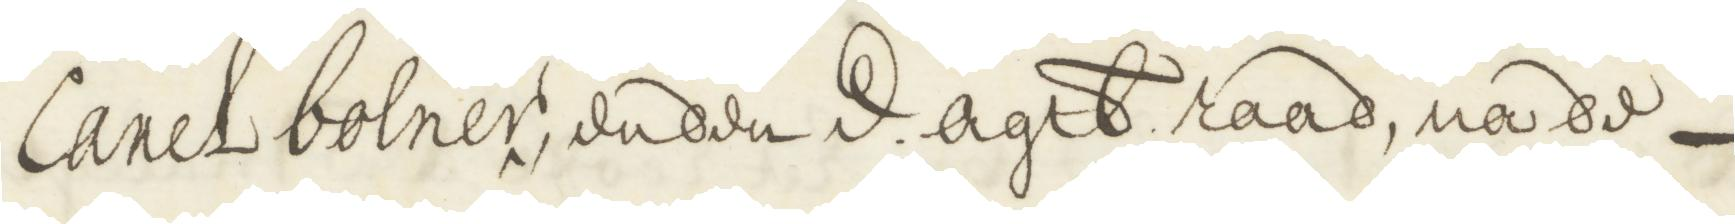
Carel bolner^, en den E. agtb. raad, na de _
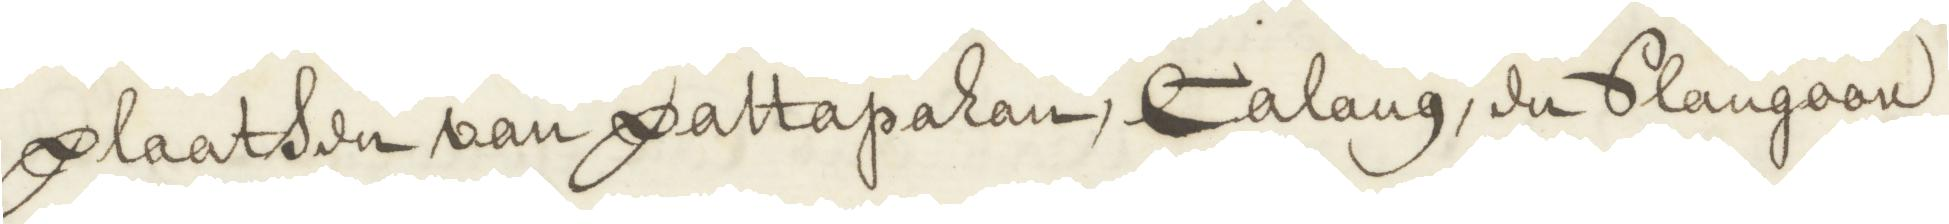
plaatsen van pattapahan, Calang, en slangoon
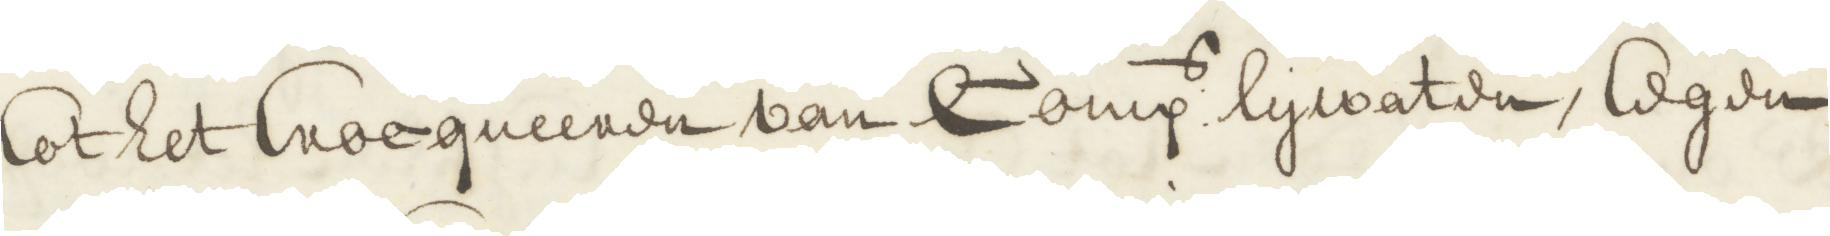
tot het trocqueeren van Comp:s lijwaten, tegen
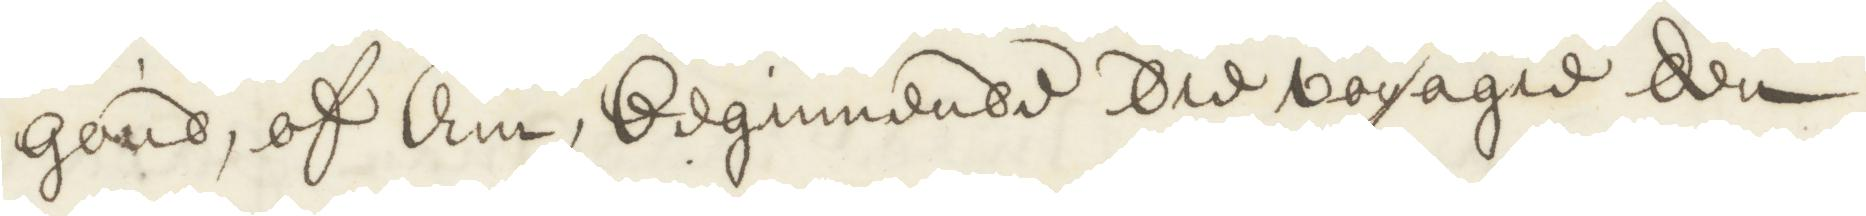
goud, of thin, beginnende die voijagie den
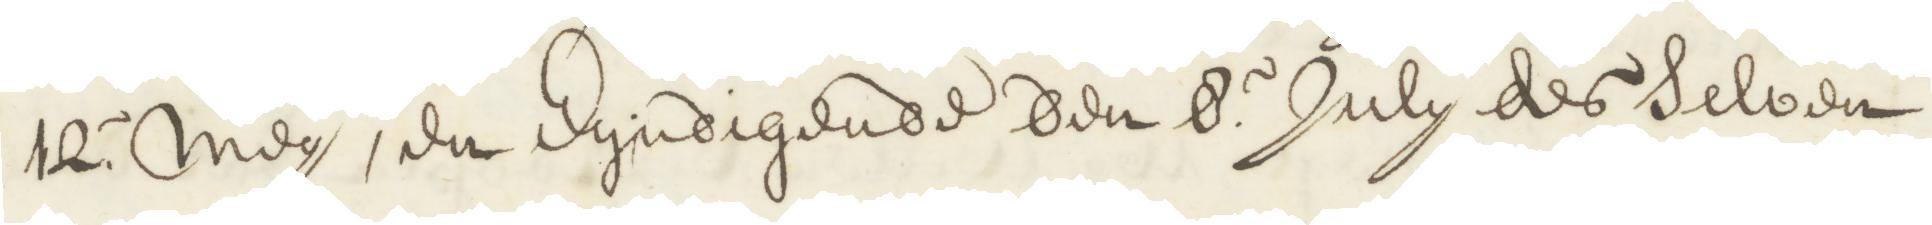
12.' mey, en Eijndigende den 8.' Julij des selven
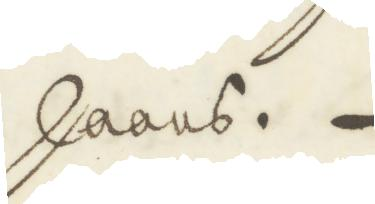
Jaars. _
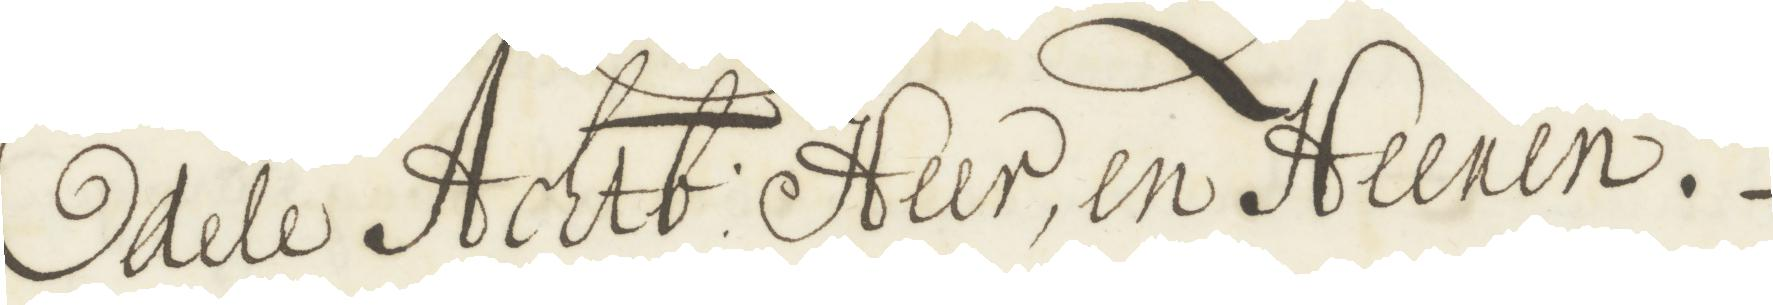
Edele Achtb: Heer, en Heeren. _
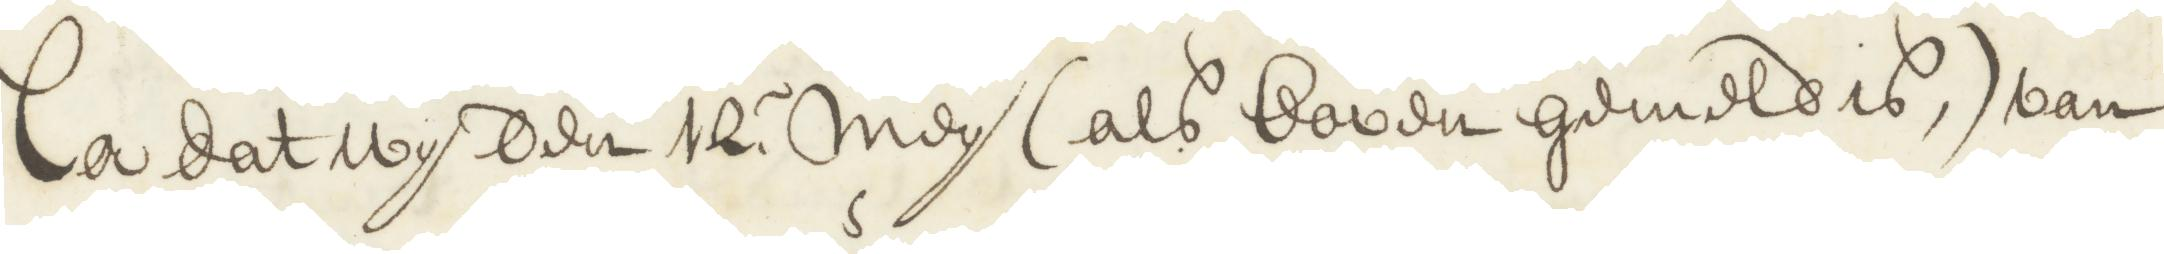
Na dat wij den 12.' mey (als boven gemeld is,) van
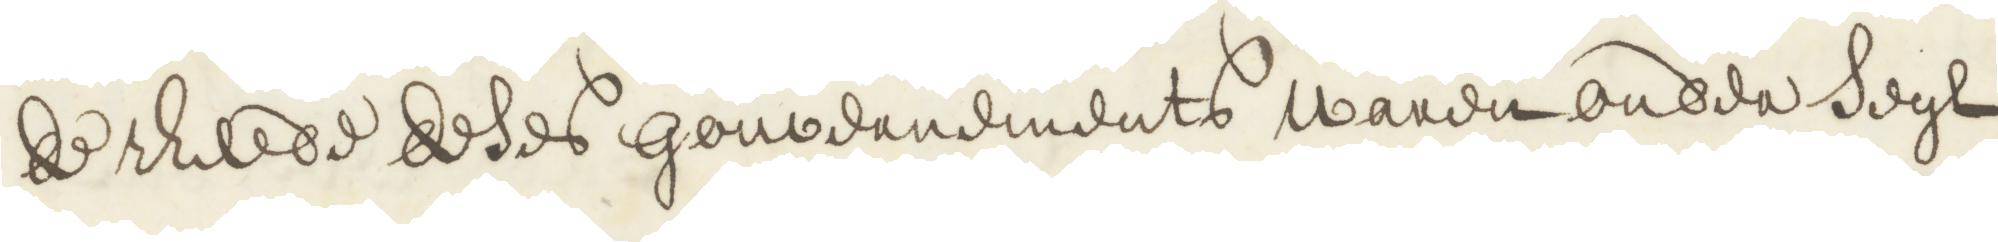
de rheede deses gouvernements waren onder seyl
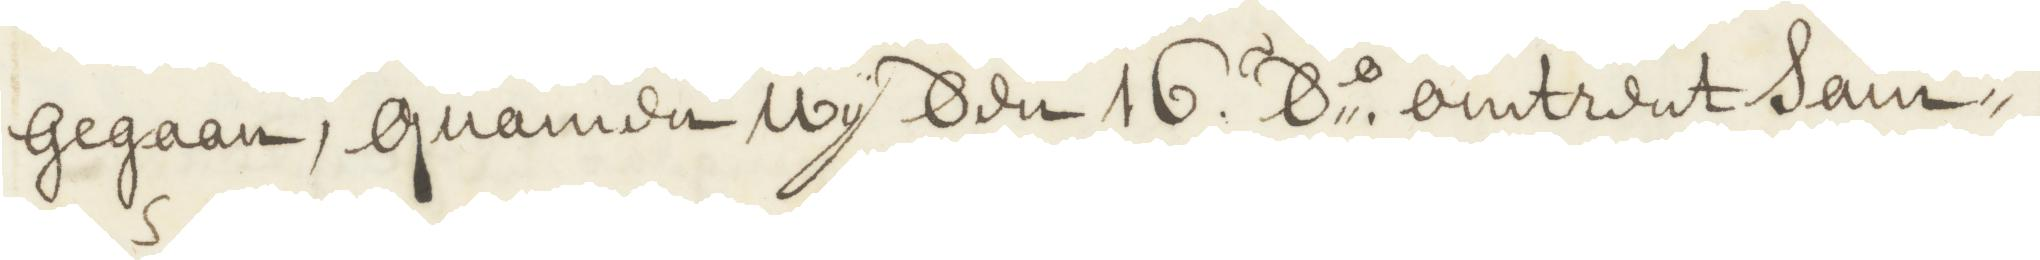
gegaan, quamen wij den 16.' d„o. omtrent Sam„
